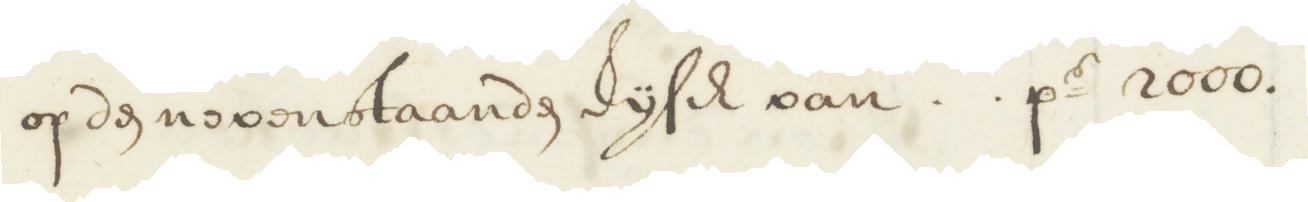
op den nevenstaanden Eijsch van . . p=s 2000.
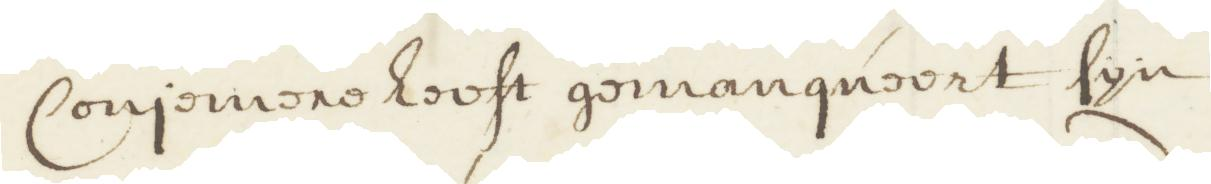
Conjemere heeft gemanqueert sijn
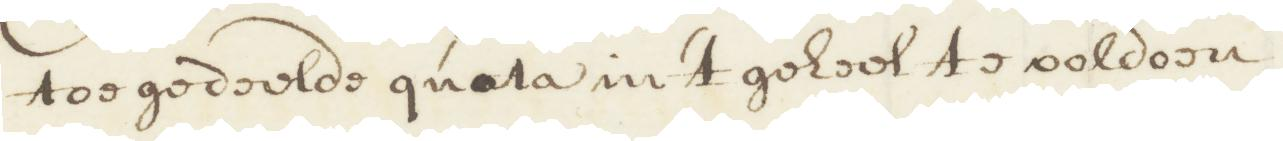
toe gedeelde quota in ’t geheel te voldoen
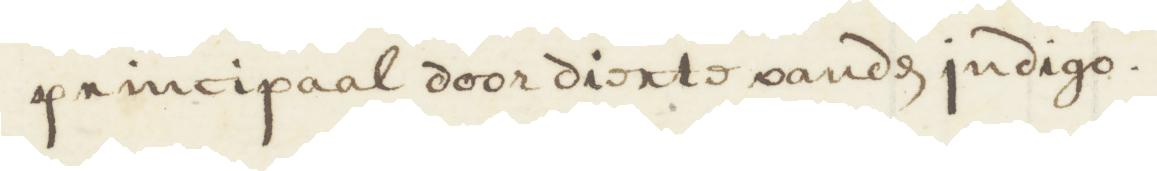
principaal door dierte vanden jndigo.
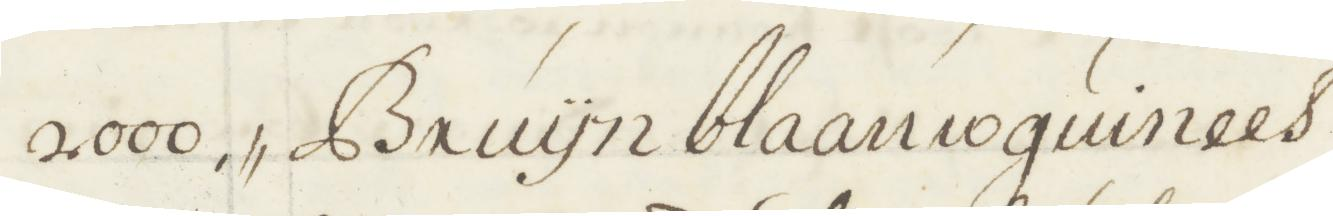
2000,„ Bruijn blaauw guinees
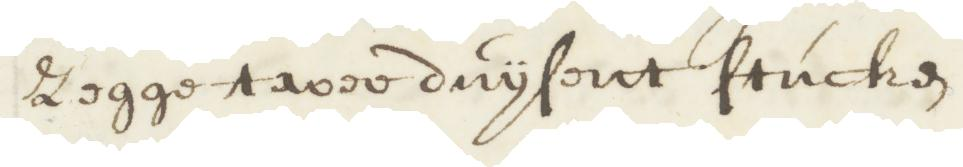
Zegge twee duijsent stucken
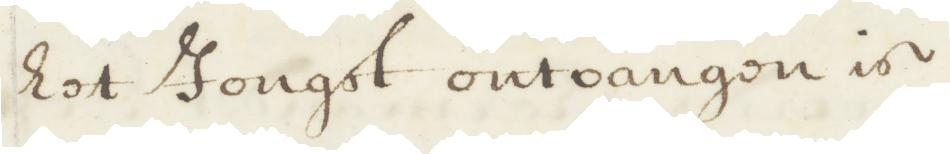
het Jongst ontvangen is
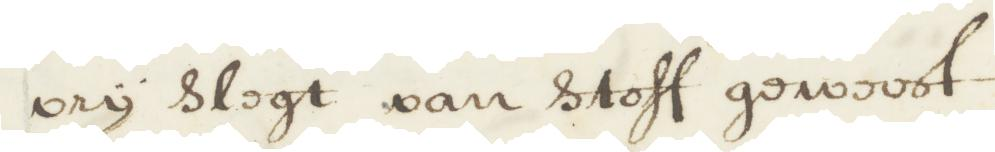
vrij slegt van stoff geweest
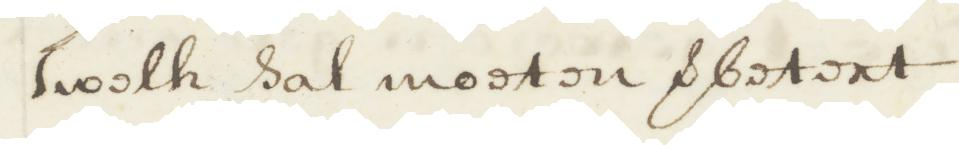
twelk sal moeten verbetert
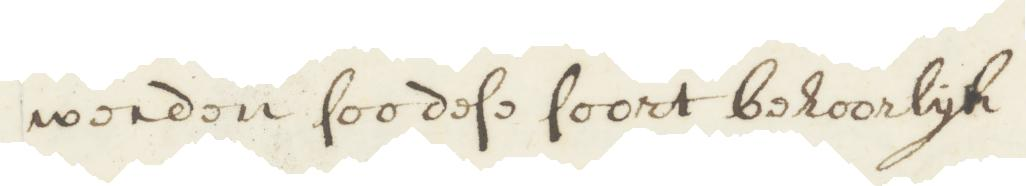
werden soo dese soort behoorlijk
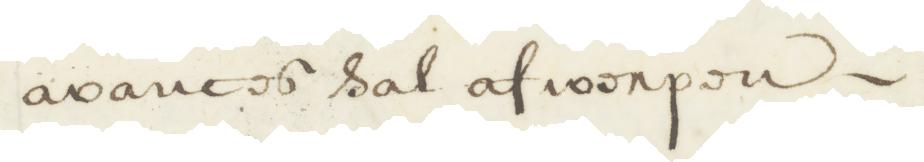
avances sal af werpen
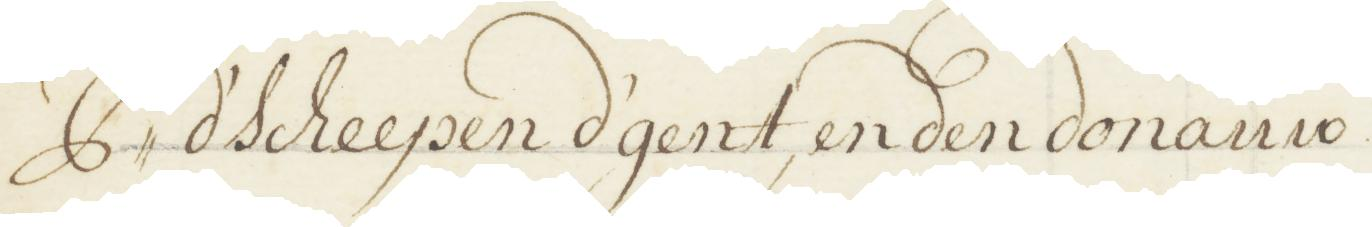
P„r d' scheepen d'gent, en den donauw
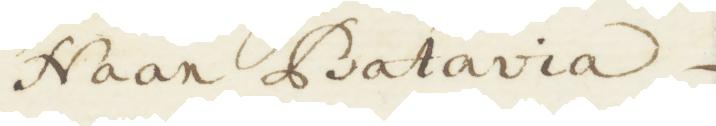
Naar Batavia
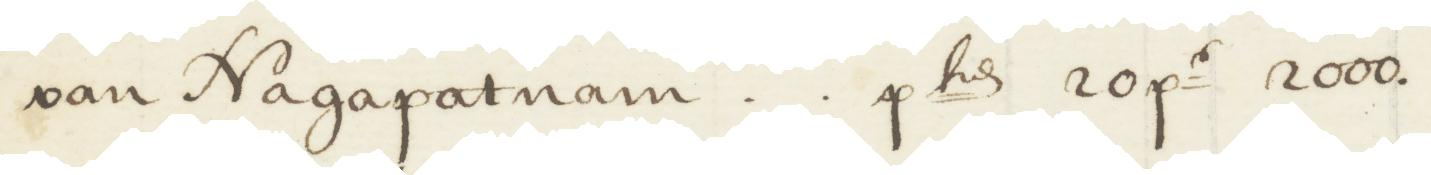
van Nagapatnam . . pken 20 p=s 2000.
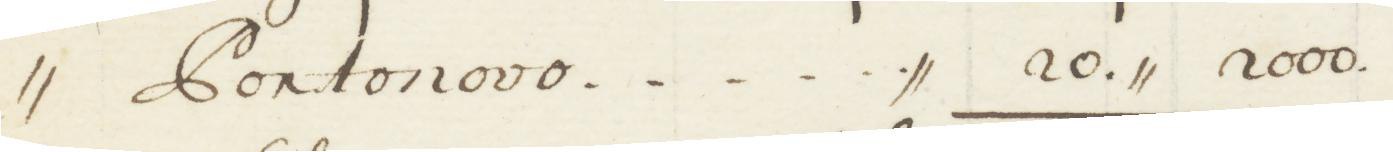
„ Portonovo - - - - - „ 20. „ 2000.
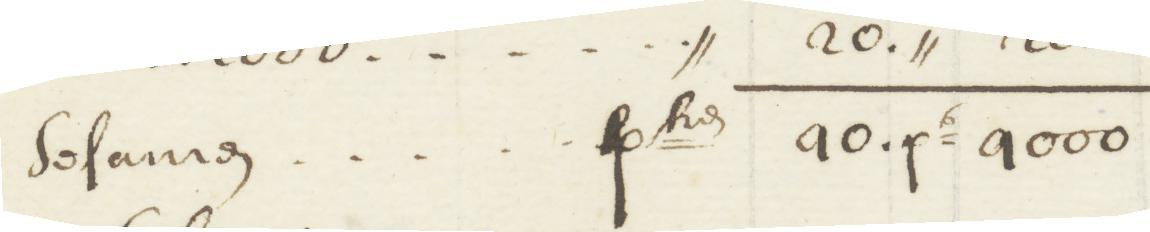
te samen - - - - - p=ken 40. p=s 4000
